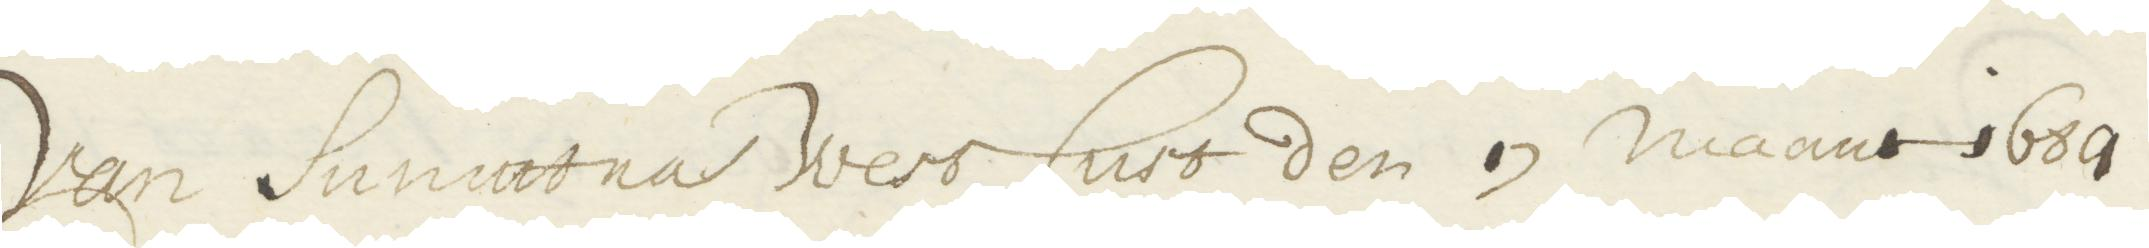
Van Sumatra West Cust den 17 maart 1689
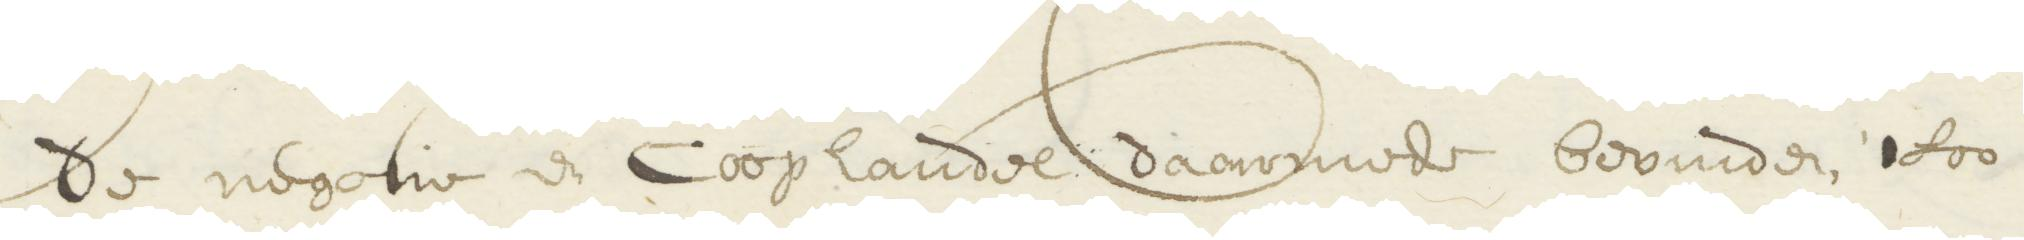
de negotie en coophandel daarmede bevinden 'tsoo
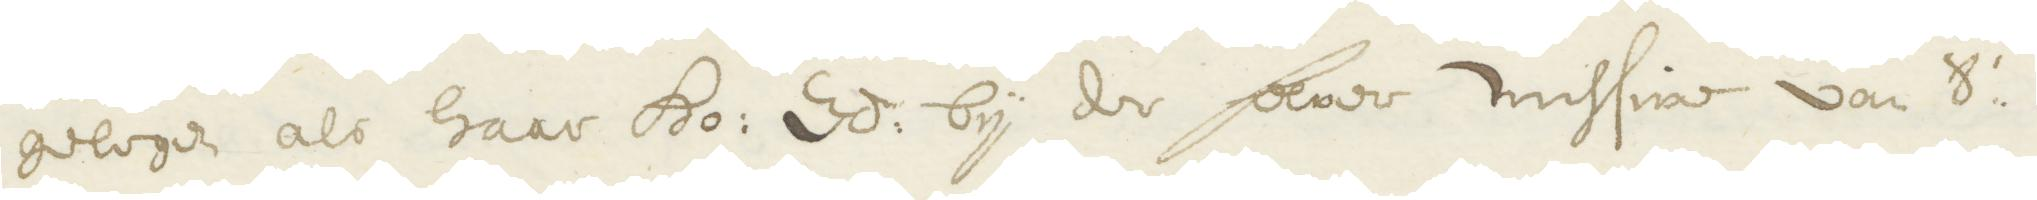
gelegen als haar Ho: Ed: bij der selver missive van 8'„
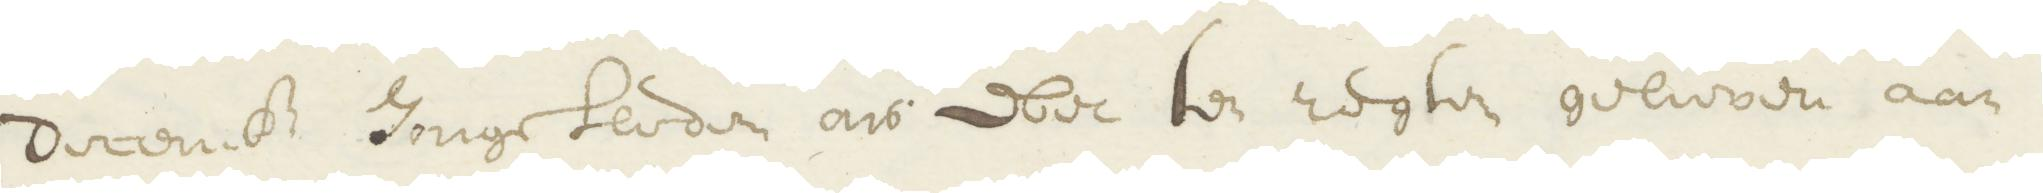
decemb: jongstleden ons wel ten regten gelieven aan
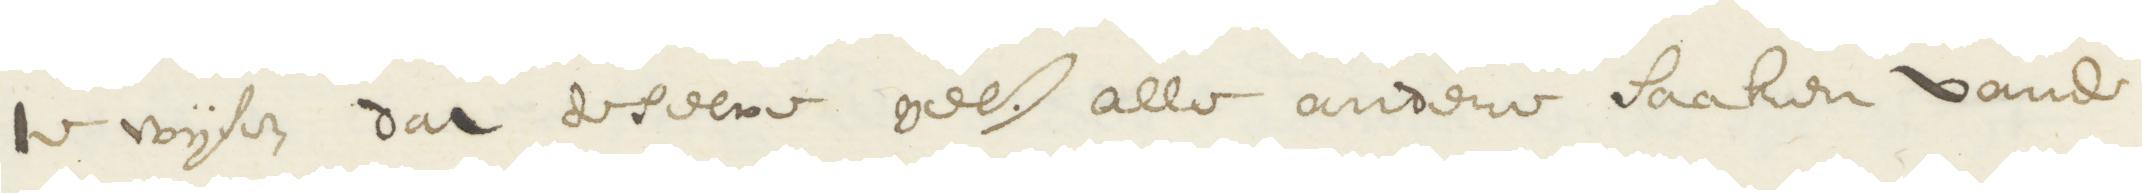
te wijsen dat deselve gelijk alle andere saaken vande
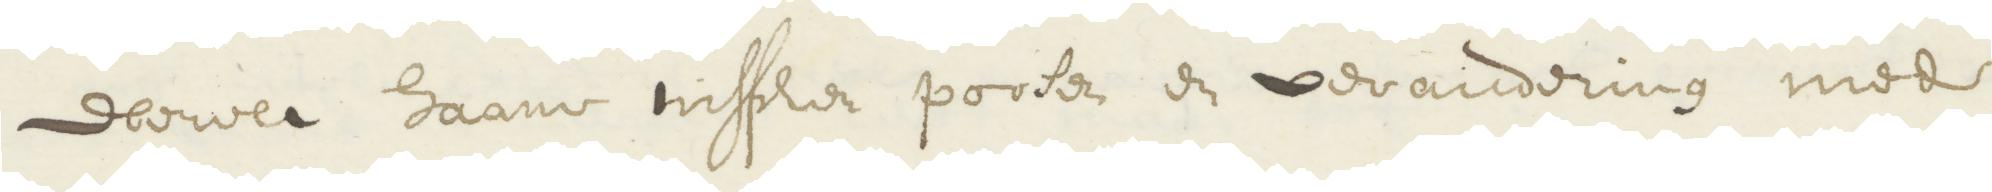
werelt haare tusschen poosen en verandering mede
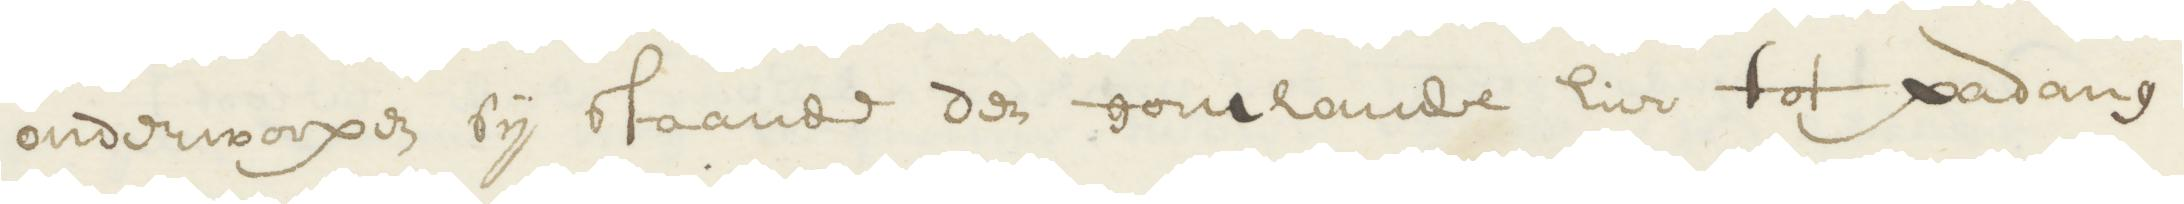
onderworpen bij staande den gouthandel hier tot padang
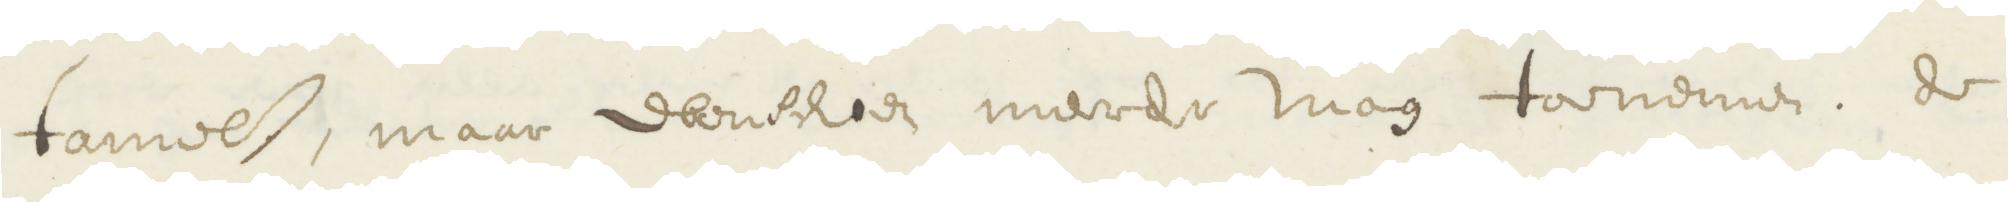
tamelijk, maar wenschen merder mag toenemen. de
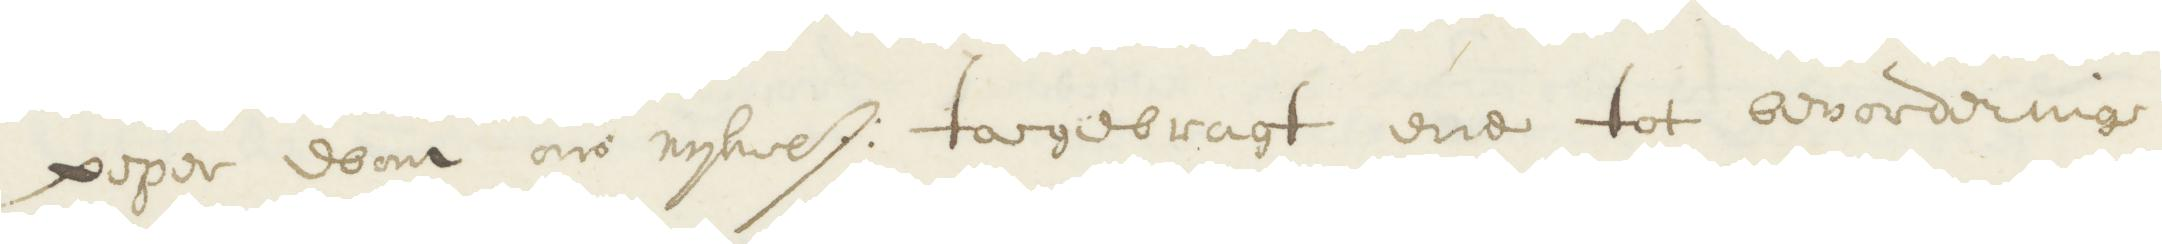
peper wort ons rykelijk toegebragt ende tot bevorderinge
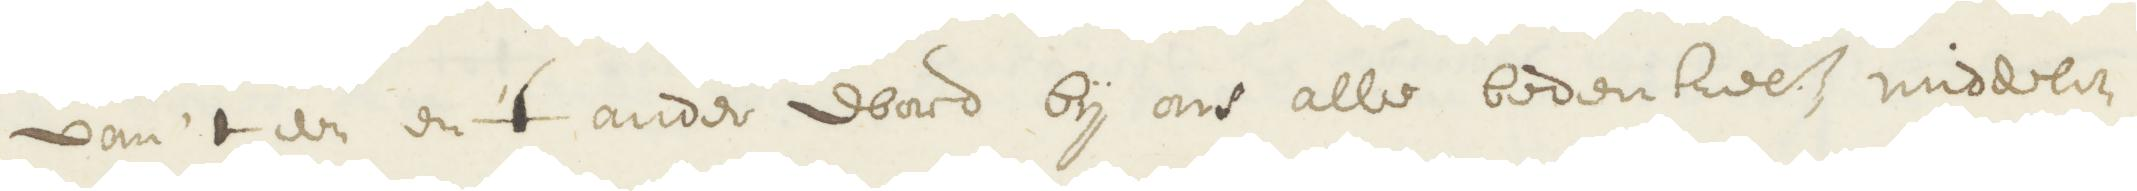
van ’t een en ’t ander word bij ons alle bedenkelijk middelen
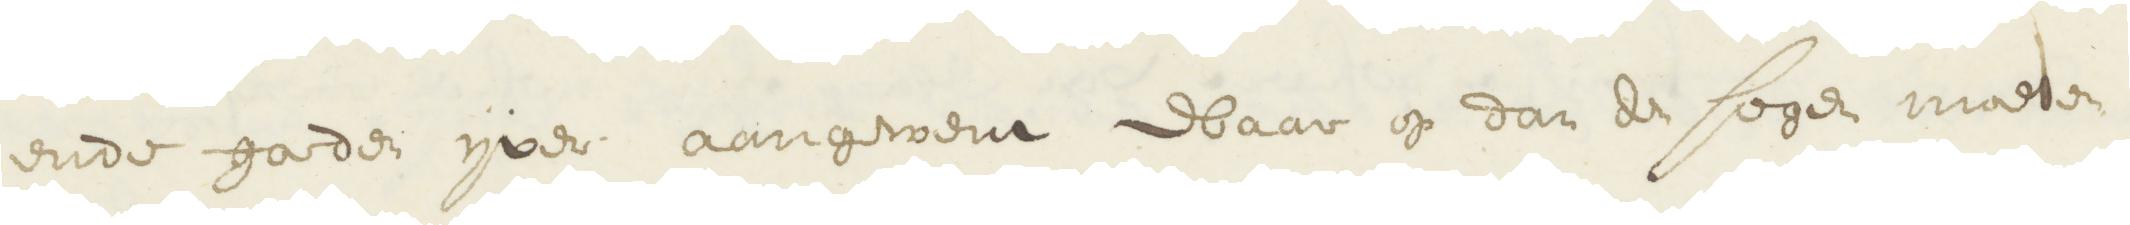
ende gaeden ijver aangewent waar op dan den Segen moeten
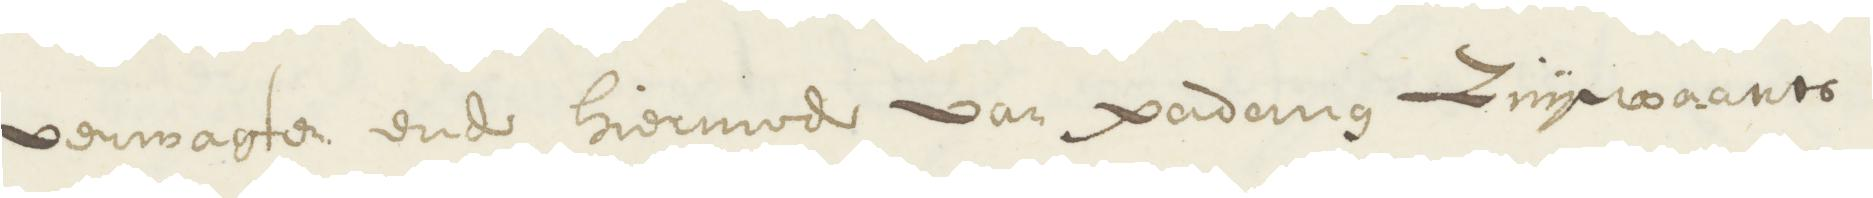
verwagten ende hiermede van padang zuijtwaarts
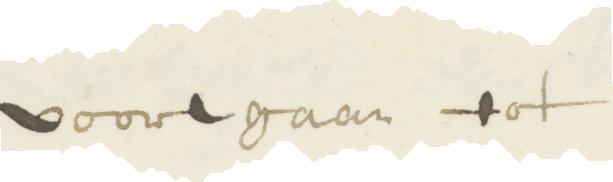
voortgaan tot
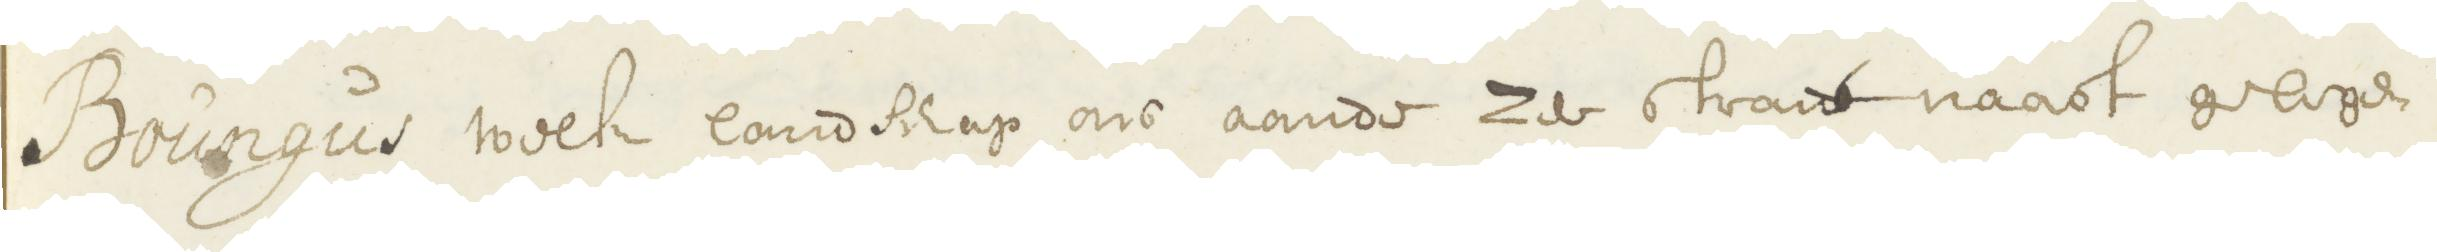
Boungus welk landschap ons aande zee strant naast gelegen
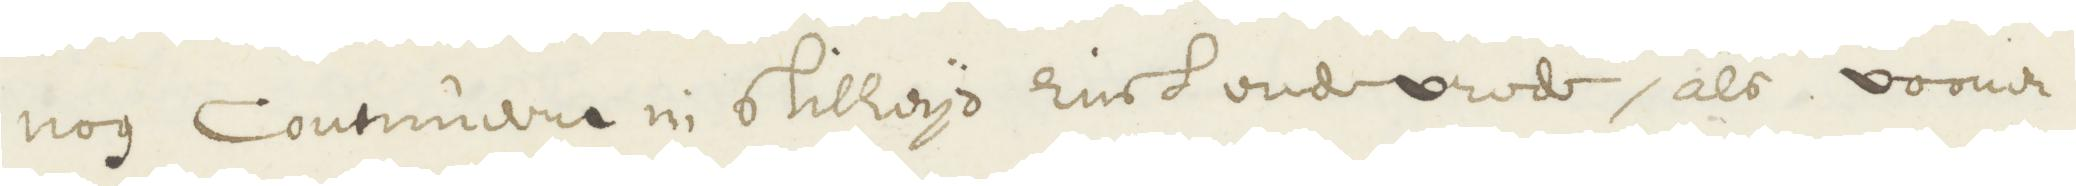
nog continueert in stilheijd rust ende vrede, als vooren
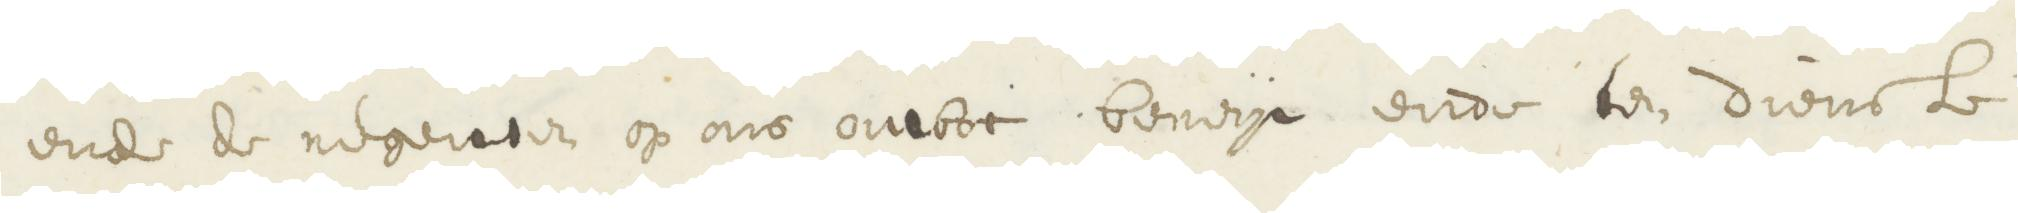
ende de regenten op ons ontbot bereijt ende ten dienste
